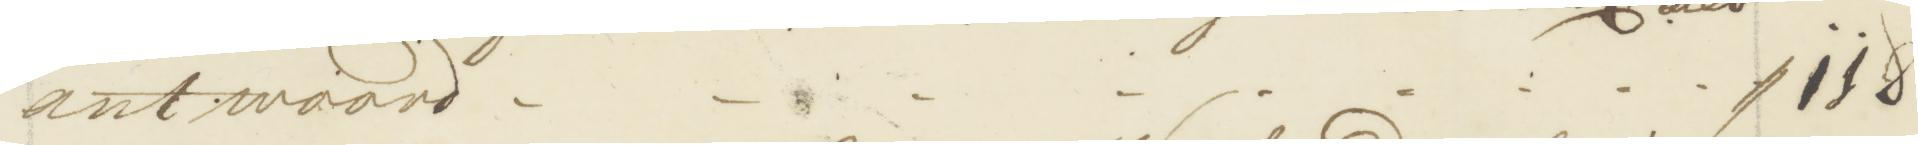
antwoord - - - - - - - - - „118
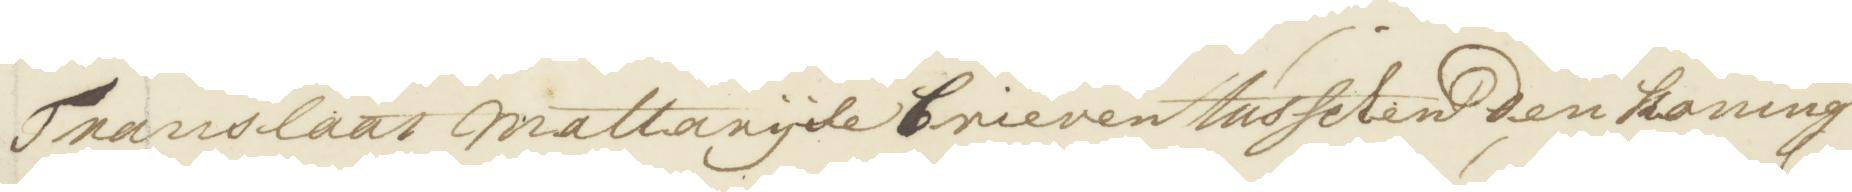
Translaat mattarijse brieven tusschen den koning
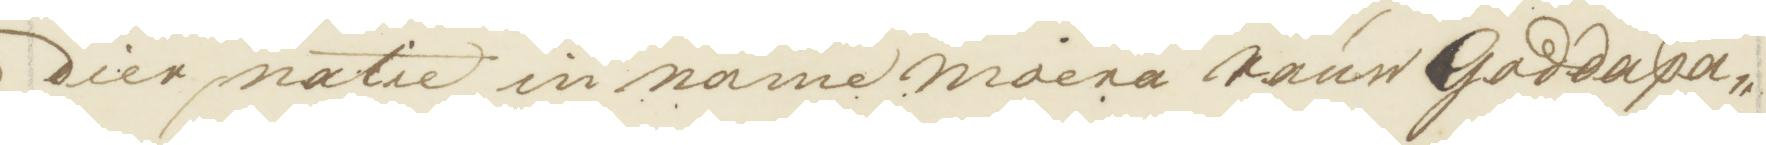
dier natie in name moera rauw Goddapa„
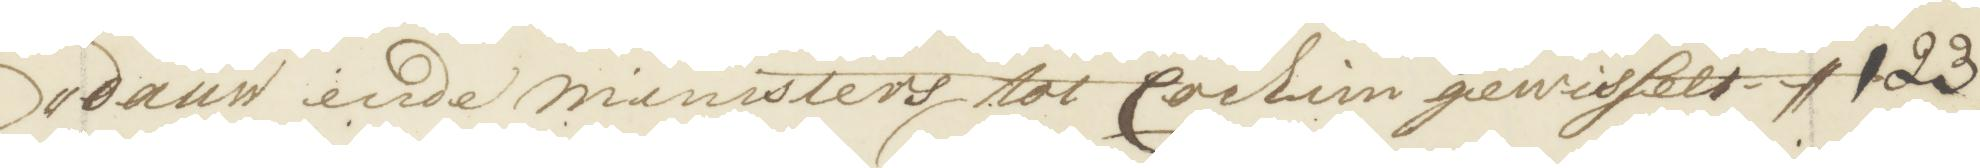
dauw ende ministers tot Cochim gewisselt - „ 123
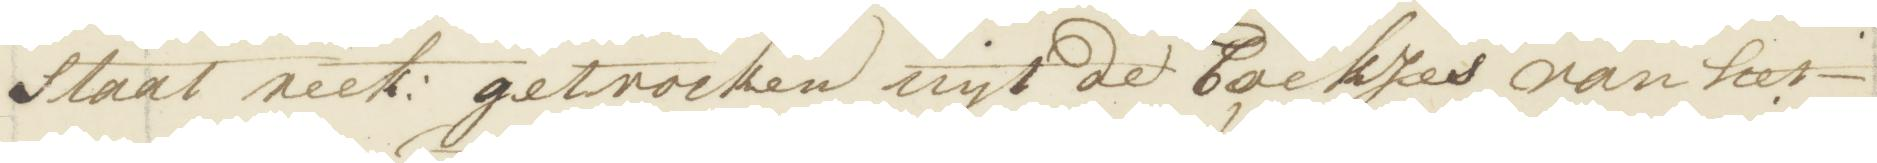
staat reek: getrocken uijt de boekjes van het -
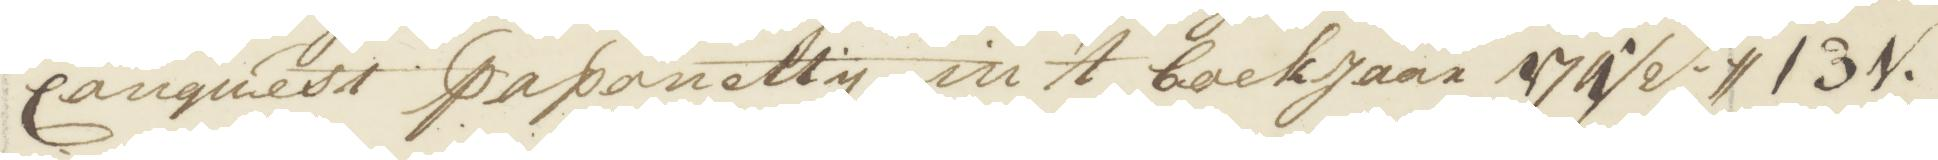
conquest papanettij in ’t boekjaar 174½ - „ 131.
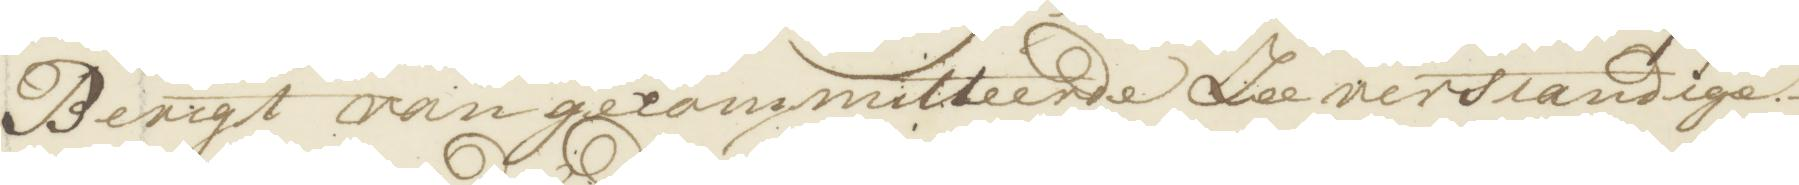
Berigt van gecommitteerde zee verstandige.-
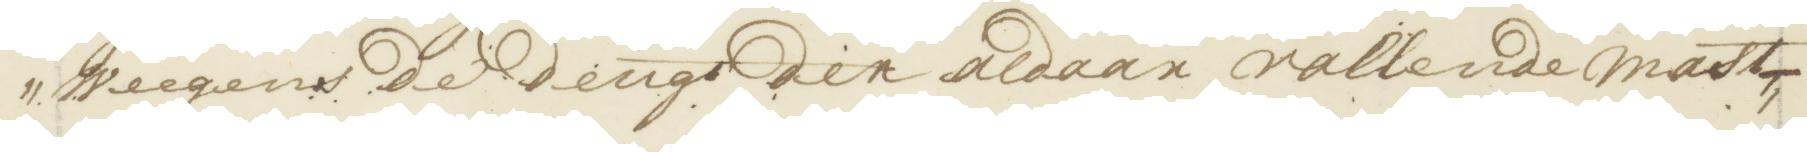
„weegens de deugt der aldaar vallende mast„
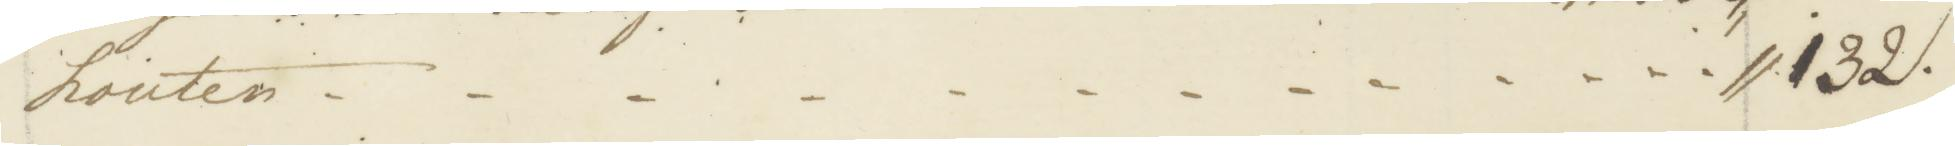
houten - - - - - - - - - - - - „132.
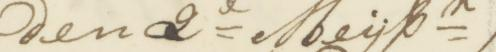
den 2=e Meij p=r
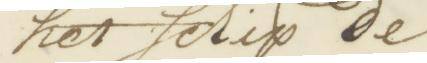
het schip de
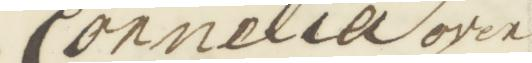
Cornelia over
